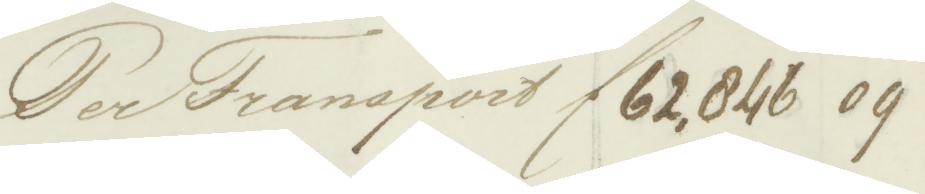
Per Transport ƒ62,846 09
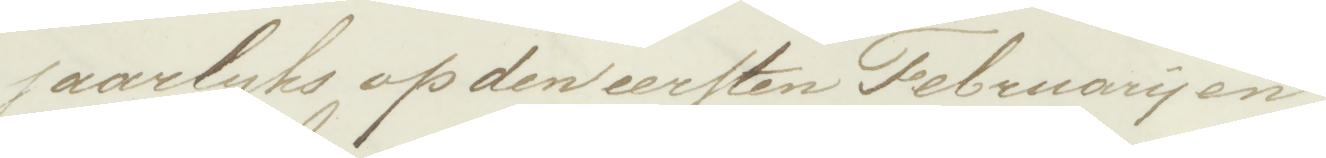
jaarlyks, op den eersten Februarij en
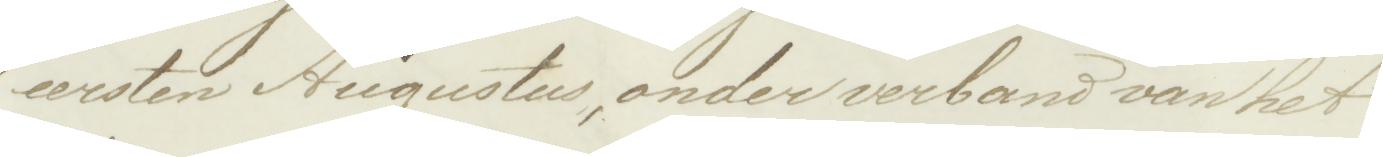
eersten Augustus, onder verband van het
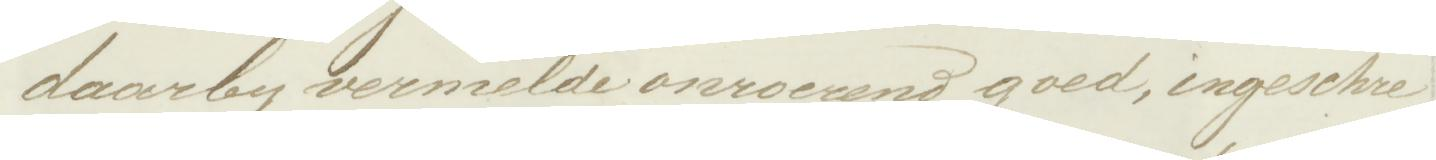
daarby vermelde onroerend goed, ingeschre
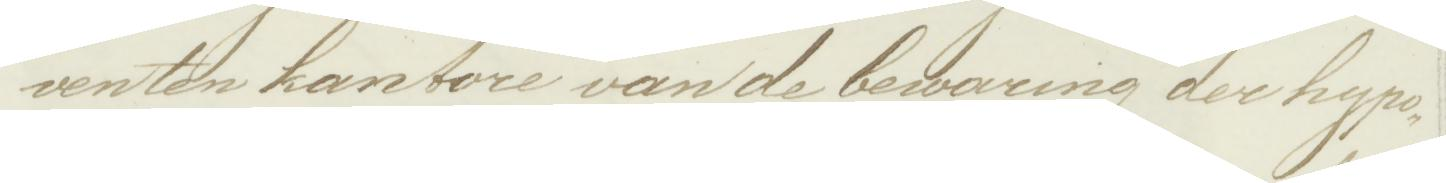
ven ten kantore van de bewaring der hypo„
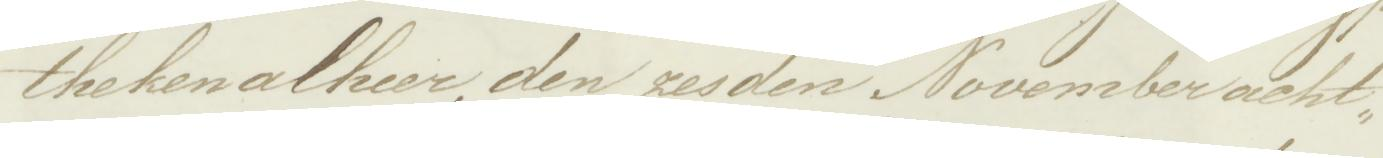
theken alhier, den zesden November acht
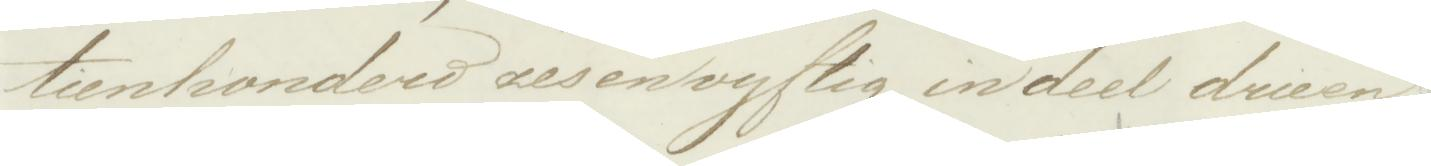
tienhonderd zes en vyftig in deel drie en
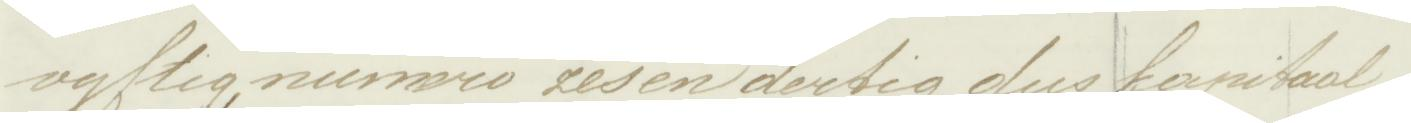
vyftig numero zes en dertig, dus kapitaal
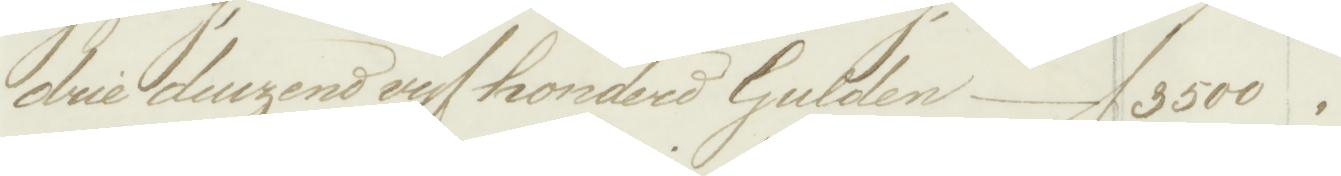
drie duizend vyf honderd Gulden —ƒ 3500 „
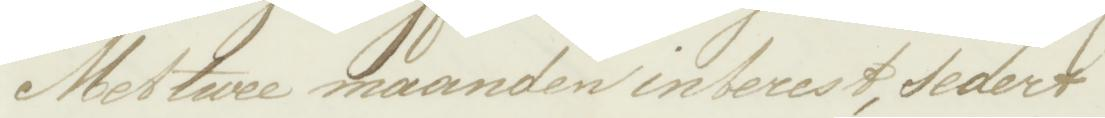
Met twee maanden interest, sedert
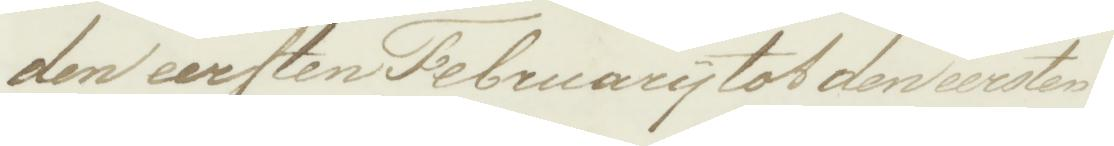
den eersten Februarij tot den eersten
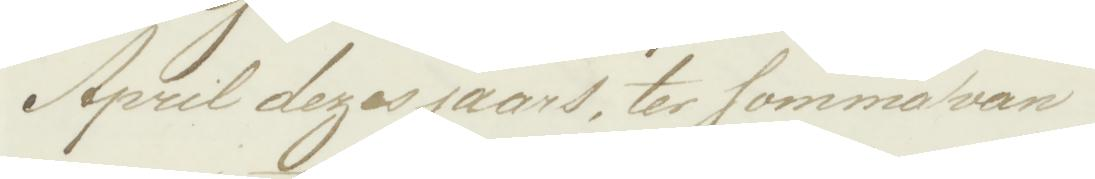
April dezes jaars, ter somma van
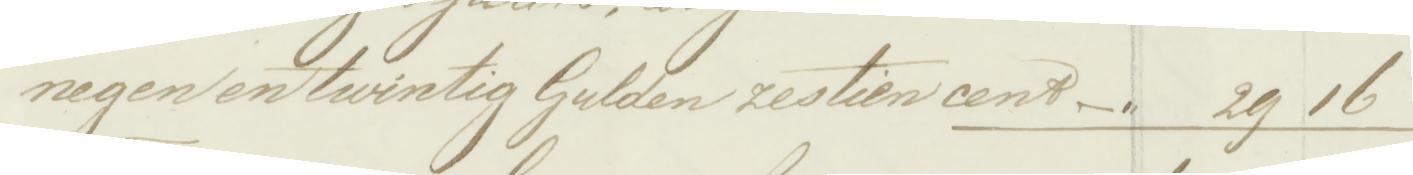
negen en twintig Gulden zestien cent —„ 29 16
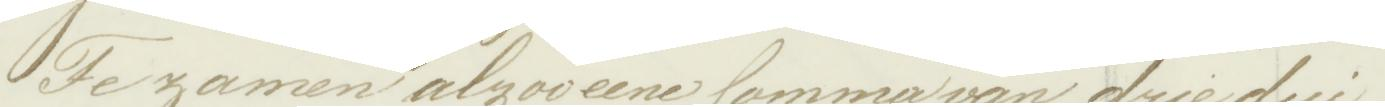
Te zamen alzoo eene somma van drie dui
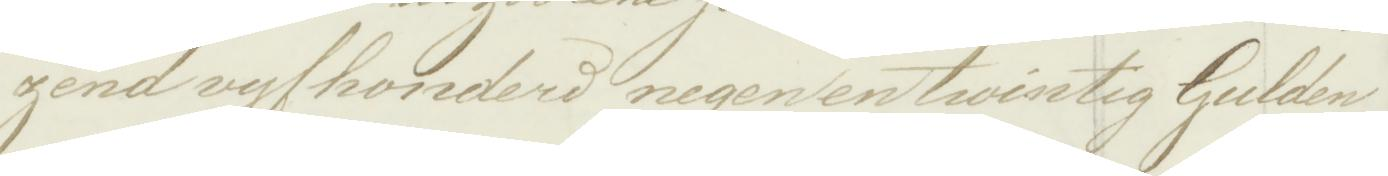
zend vyf honderd negen en twintig Gulden
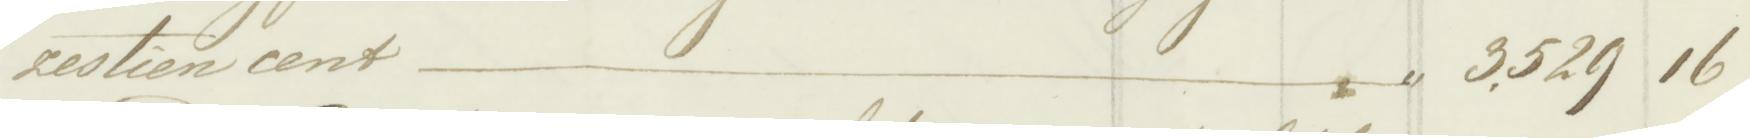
zestien cent — „ 3.529 16
